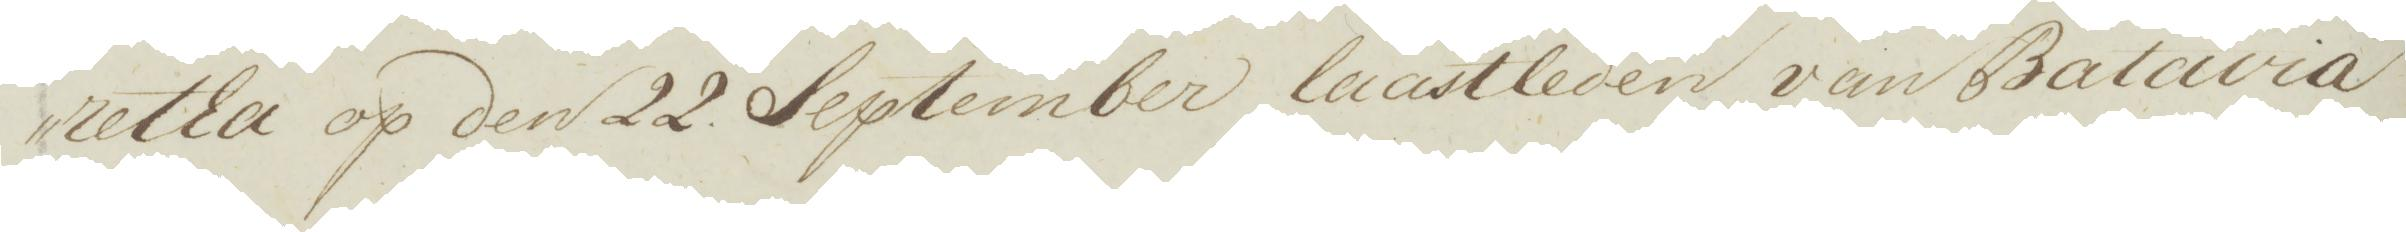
„retha op den 22. September laastleden van Batavia
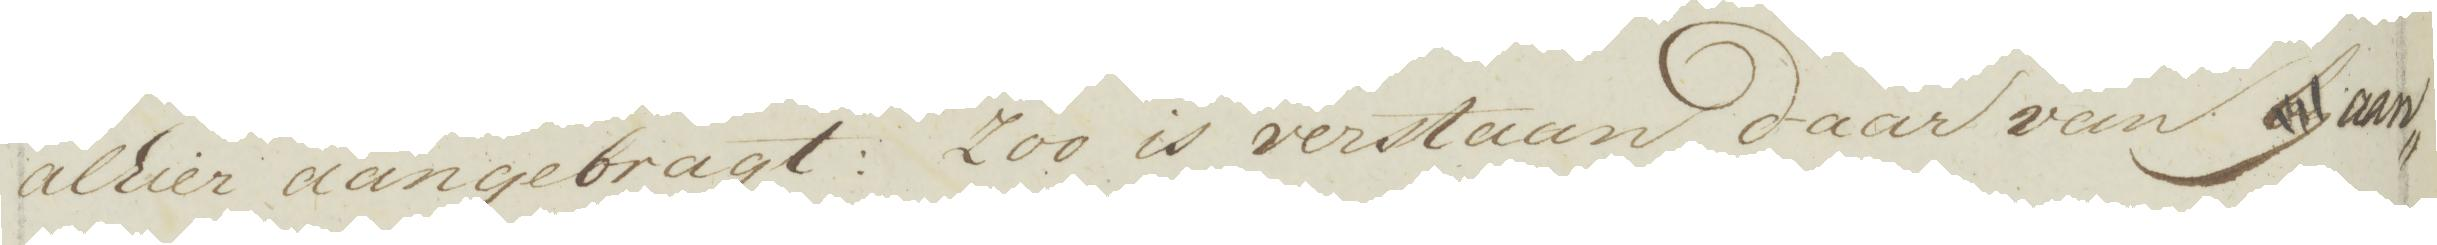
alhier aangebragt: zoo is verstaan daar van bij aan„
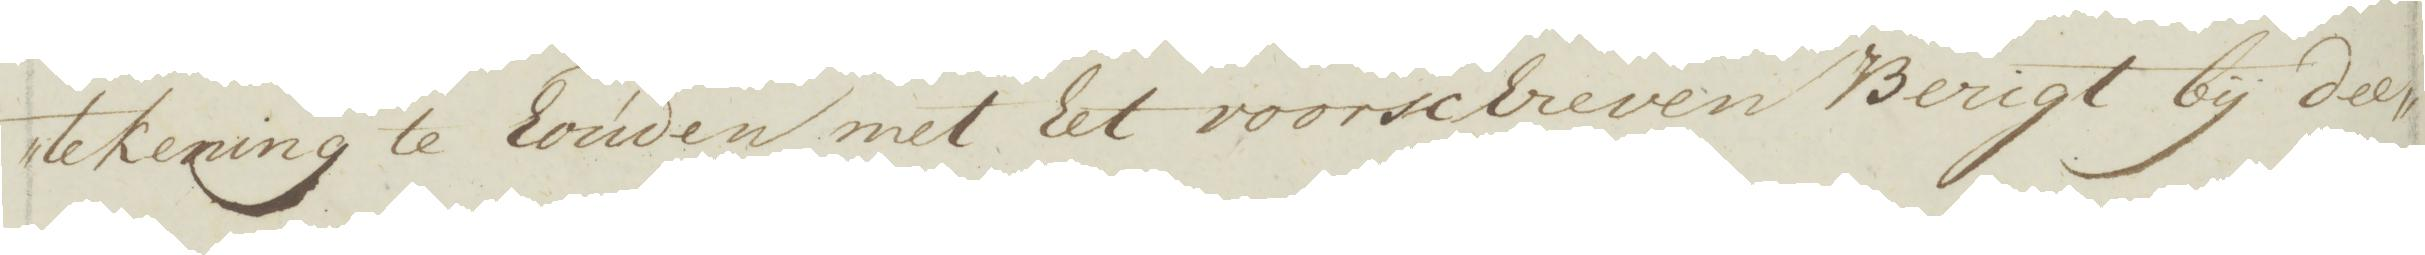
„tekening te houden met het voorschreven Berigt bij dee„
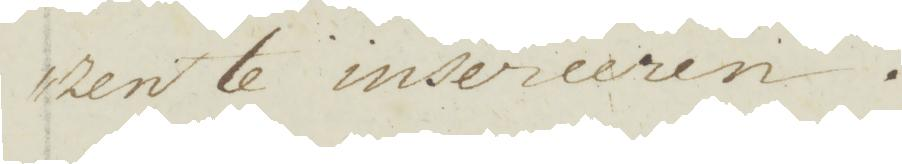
„zen te insereeren.
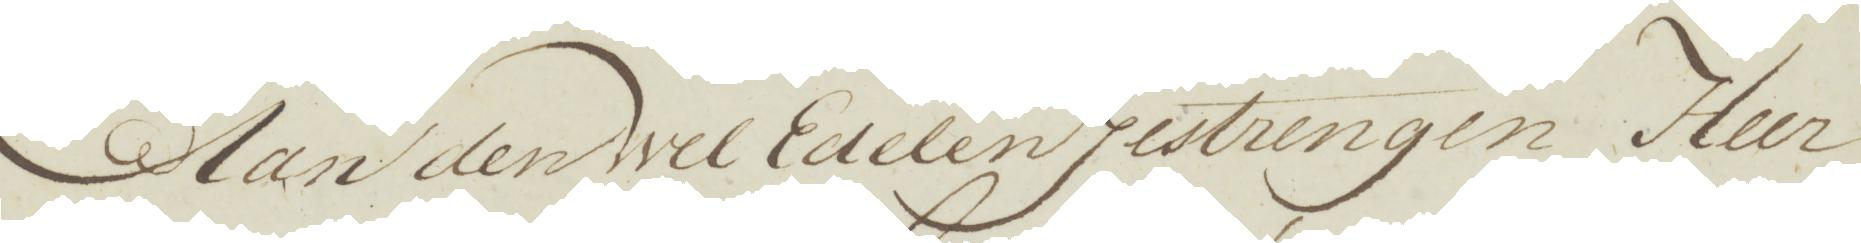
Aan den wel Edelen Gestrengen Heer
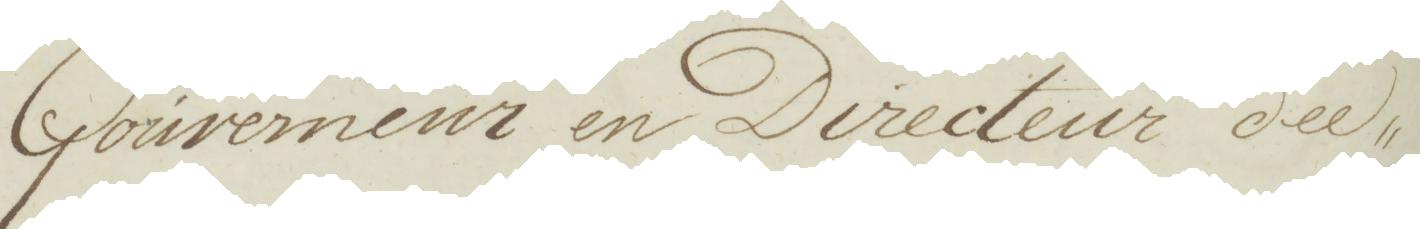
Gouverneur en Directeur dee„
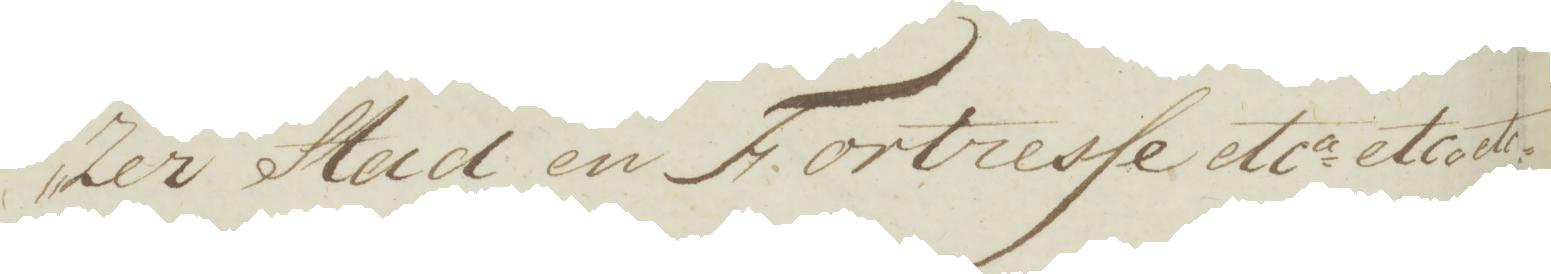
„zer Stad en Fortresse etc=a etc= etc=
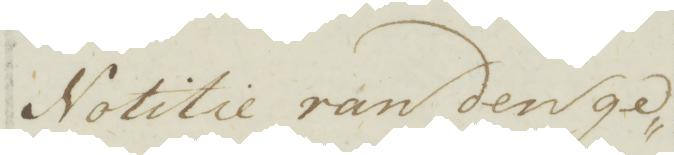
Notitie van den ge„
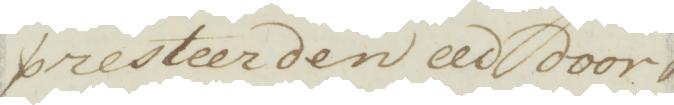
presteerden eed door
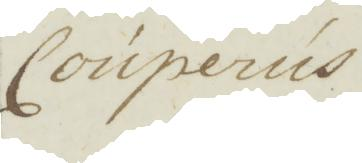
Couperus
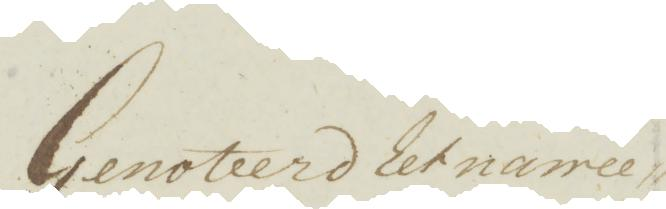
Genoteerd het nawee„
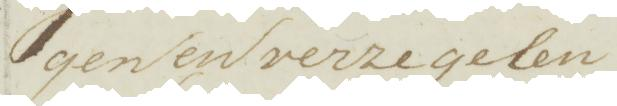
gen en verzegelen
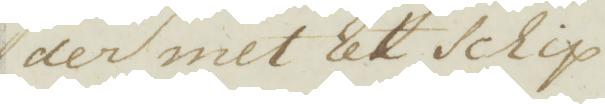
der met het schip
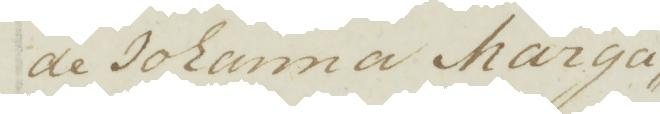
de Johanna Marga
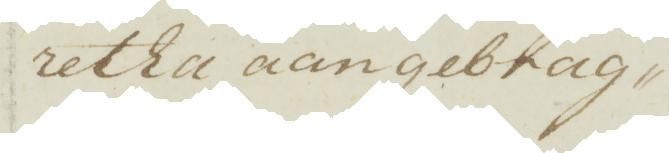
retha aan gebrag„
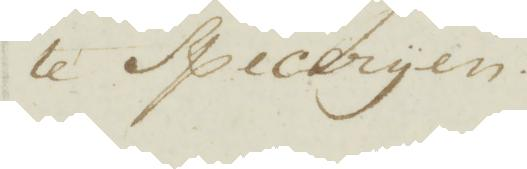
te Specerijen
